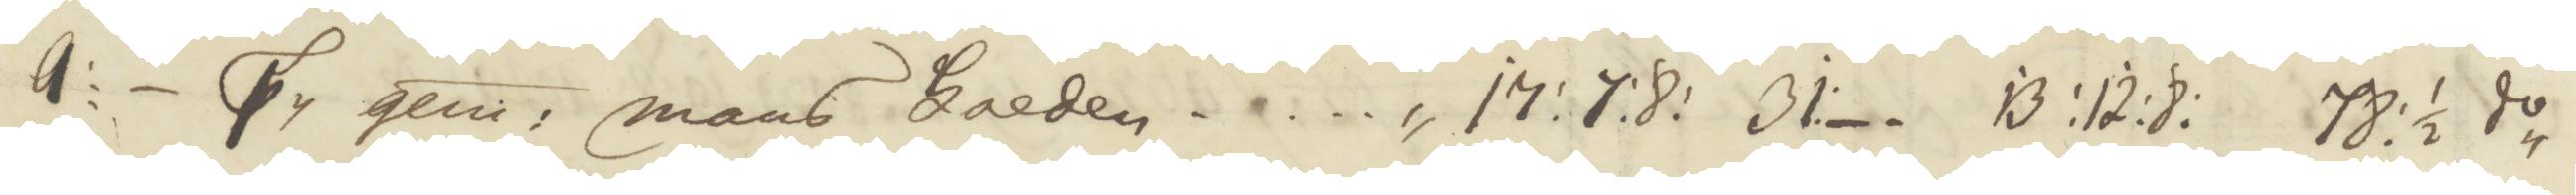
4: - p„s gem: mans hoeden . . . . „ 17: 7:8: 31:_ _ 13:12:8: 78:½ d„o
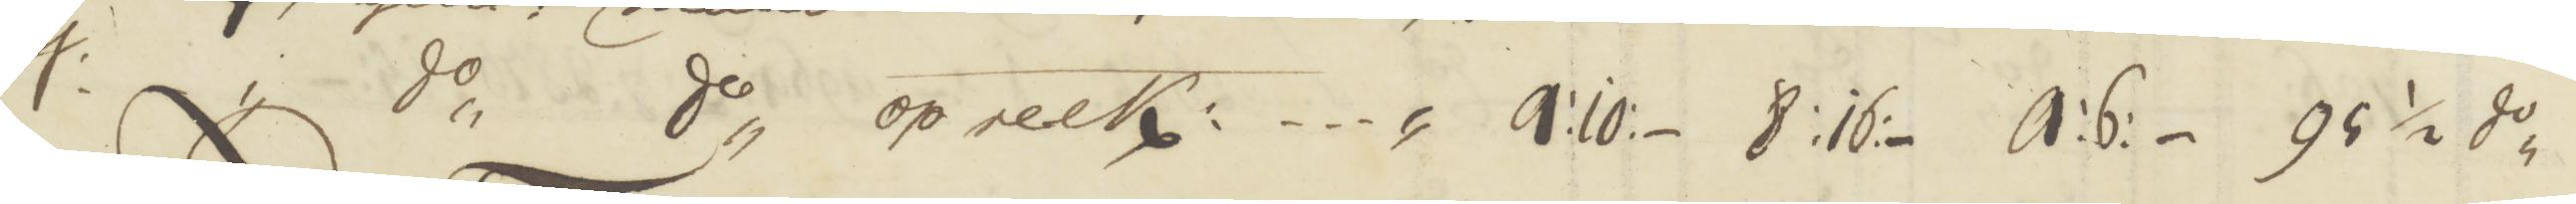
1: „ d„o d„o op reek: ... „ 4:10: - 8:16:- 4:6:- 95½ d„o
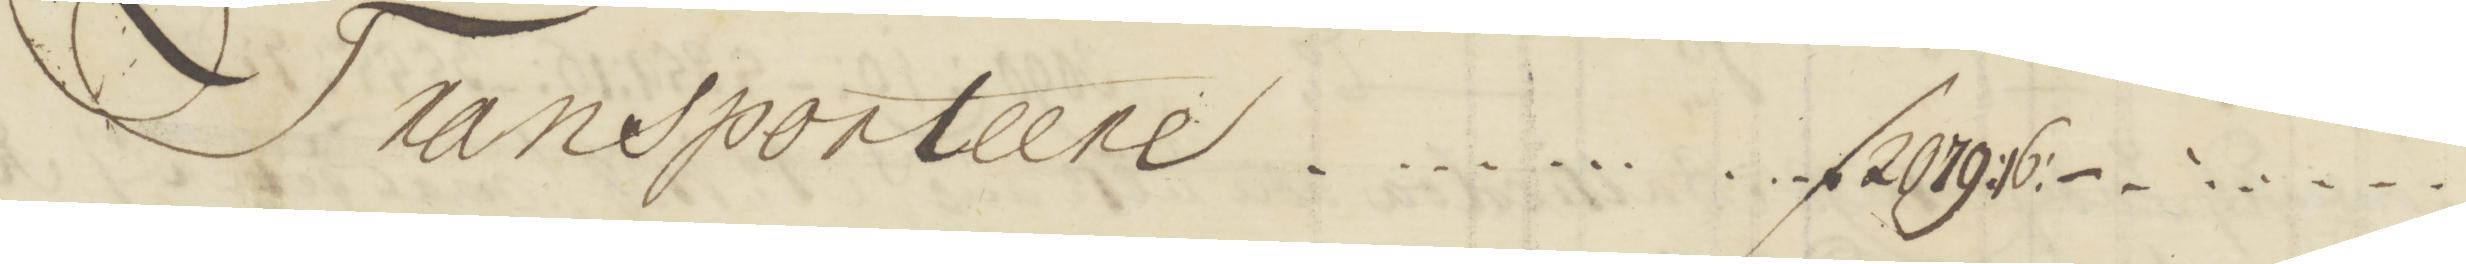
Transporteere . . . . . . . . . . ƒ 2079:16:- . . . . . . .
